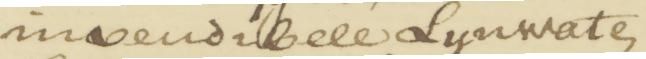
invendibele Lynwaten
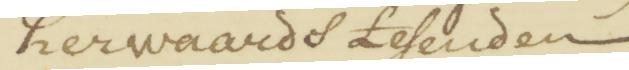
herwaards tesenden
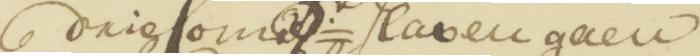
drie Comp=s slaven gaen
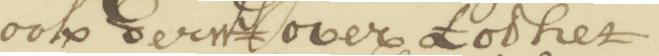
ook derw=s over tot het
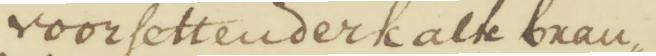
voorsetten der kalk bran„
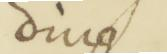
ding
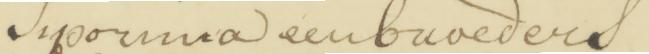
Siporima een broeders
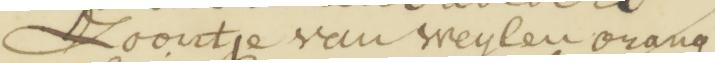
zoontje van weylen orang
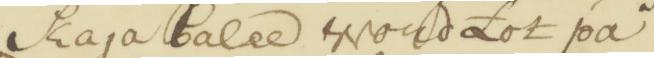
kaja balee word tot pa
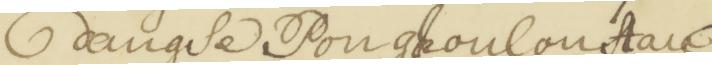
dangse Ponghouloustan
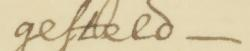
gesteld —
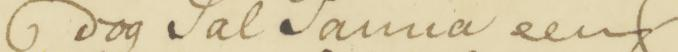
dog sal Pamia een
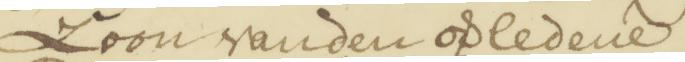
zoon van den overledene
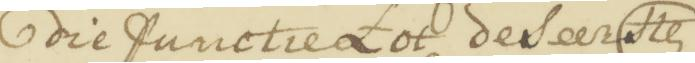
die functie tot des eersten
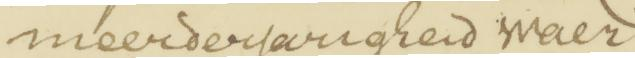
meerderjarigheid waer
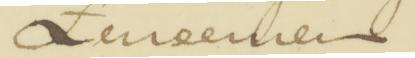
teneemen
